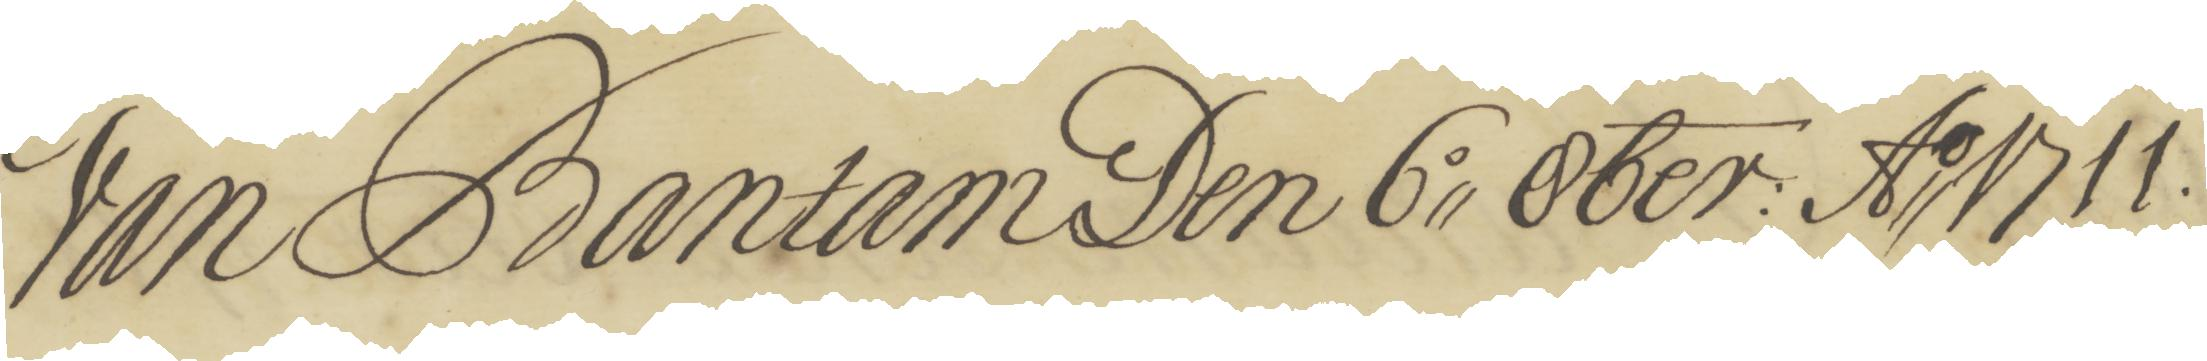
Van Bantam Den 6„o 8ber: A„o 1711.
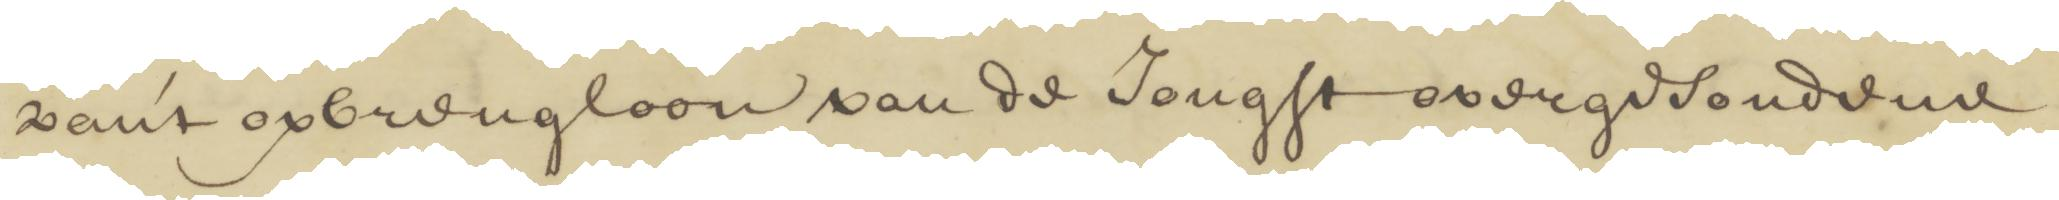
van ’t opbrengloon van de Iongst overgesondene
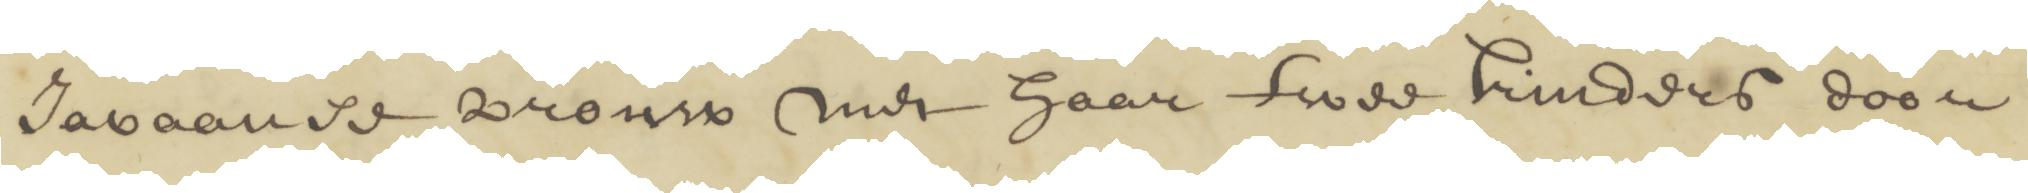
Iavaanse vrouw met haar twee kinders door
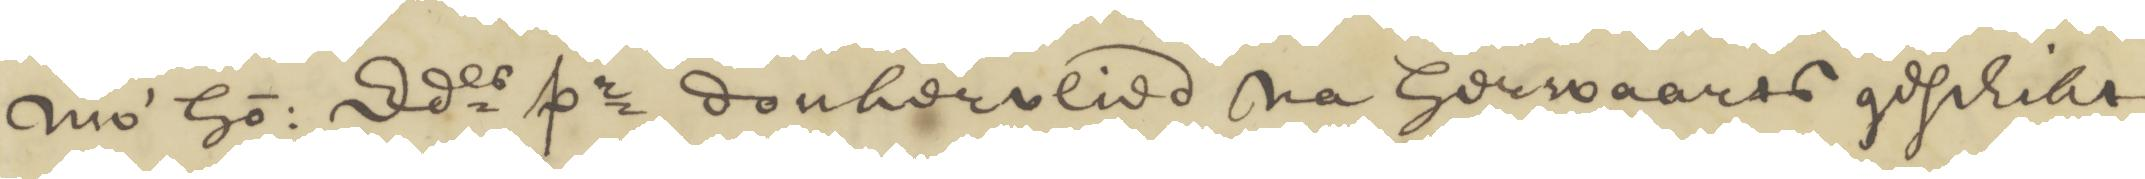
uw ho: Ed=ls p=r donkervlied na herwaarts geschikt
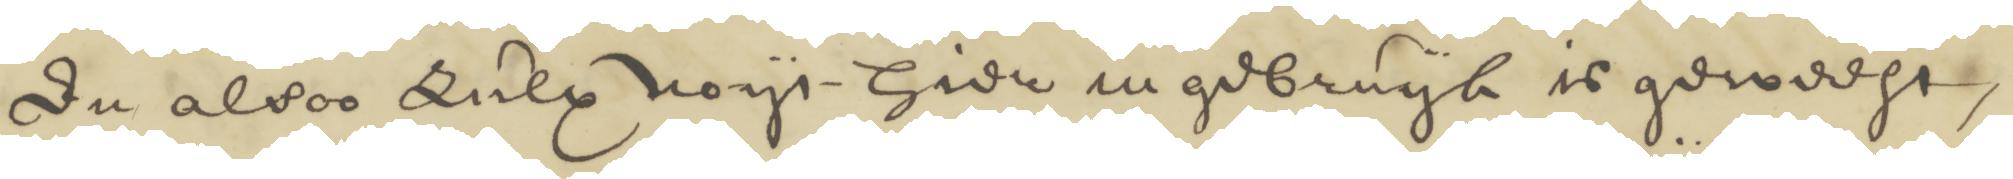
En alsoo zulx noijt hier in gebruijk is geweest,
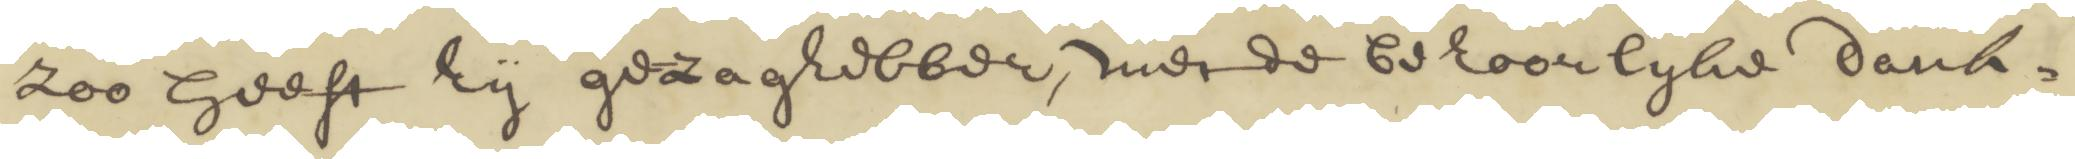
zoo heeft hij gezaghebber, met de behoorlijke dank„
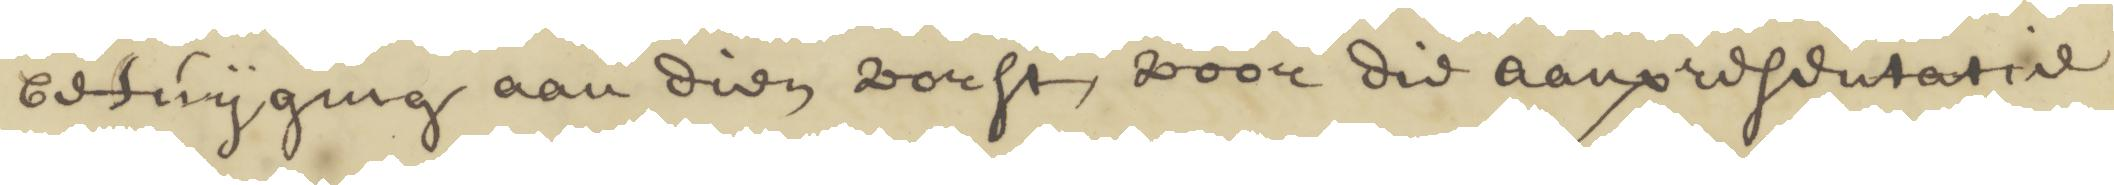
betuijging aan dien vorst, voor die aanpresentatie
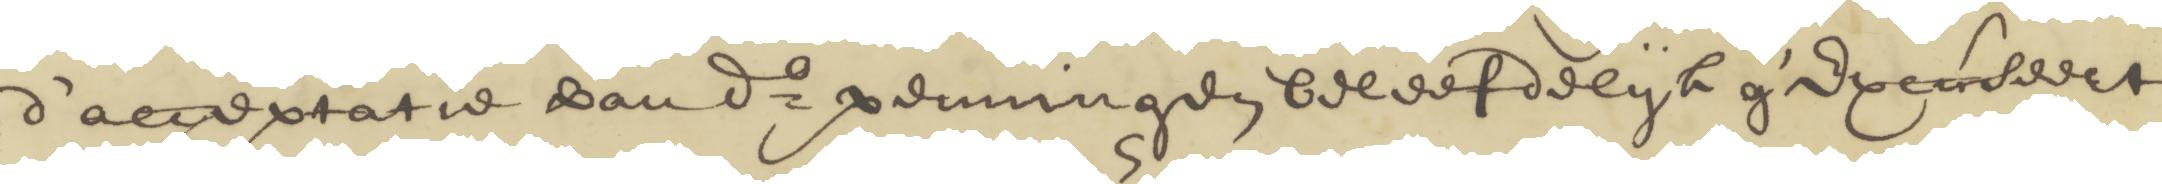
d’acceptatie van d=o penningen beleefdelijk g’Excuseert
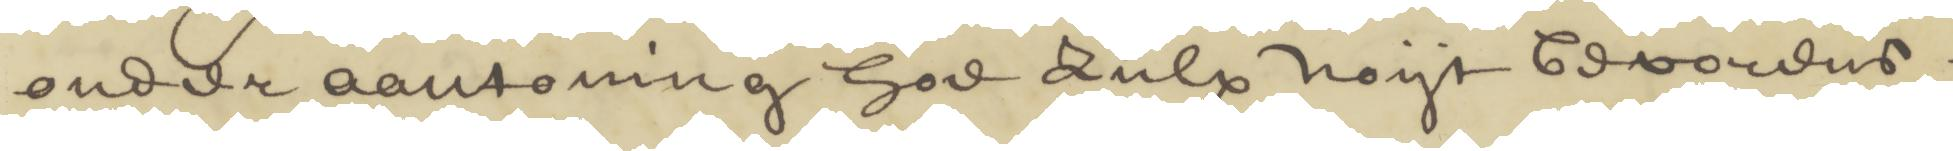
onder aantoning hoe zulx noijt bevorens
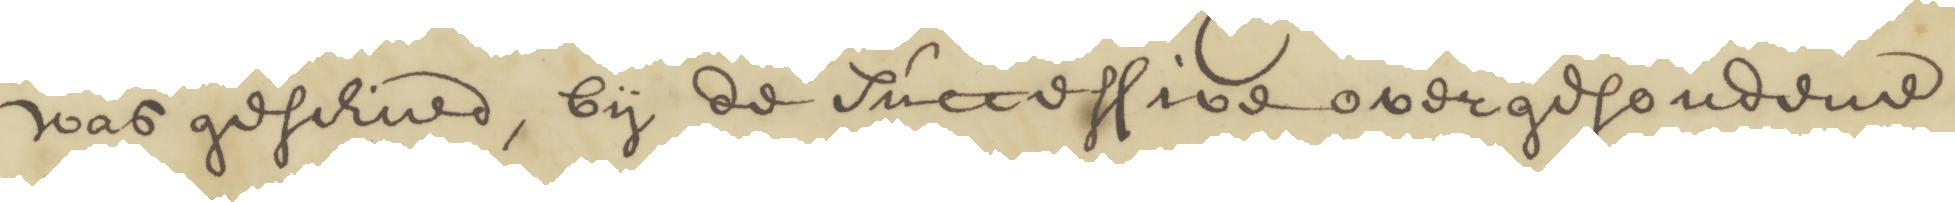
was geschied, bij de successive overgesondene
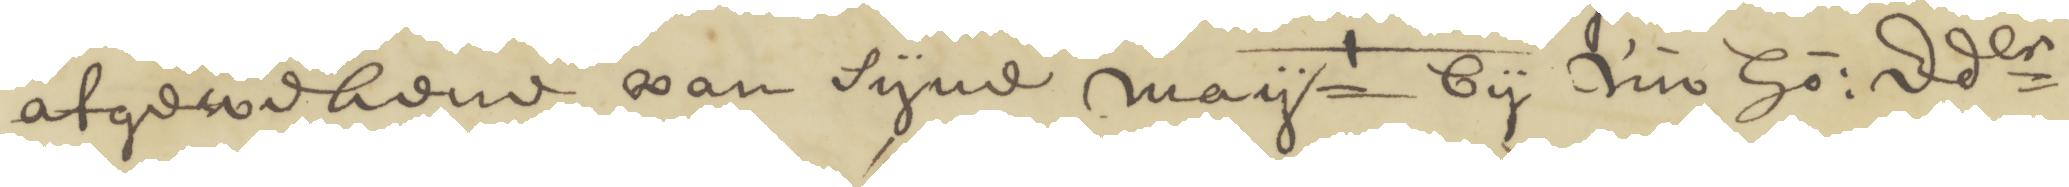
afgewekene van sijne maij=t bij uw ho: Ed=le
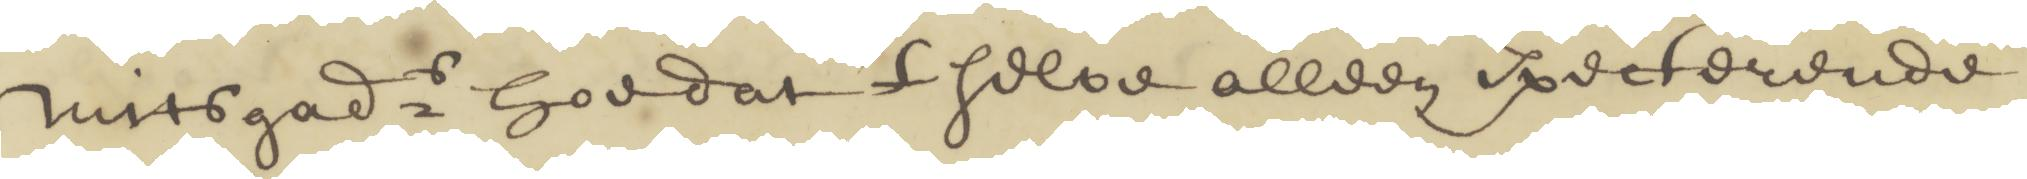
mitsgad=s hoedat 't selve alleen specterende
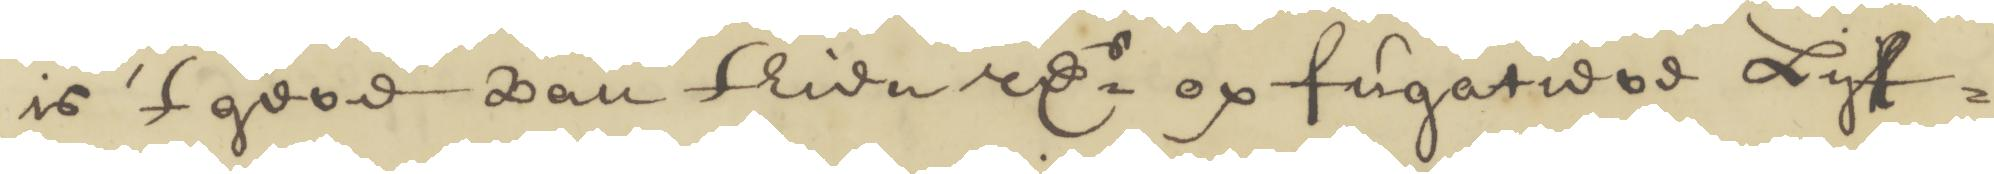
is ’t geve van thien rx=s op fugatieve Lijf=
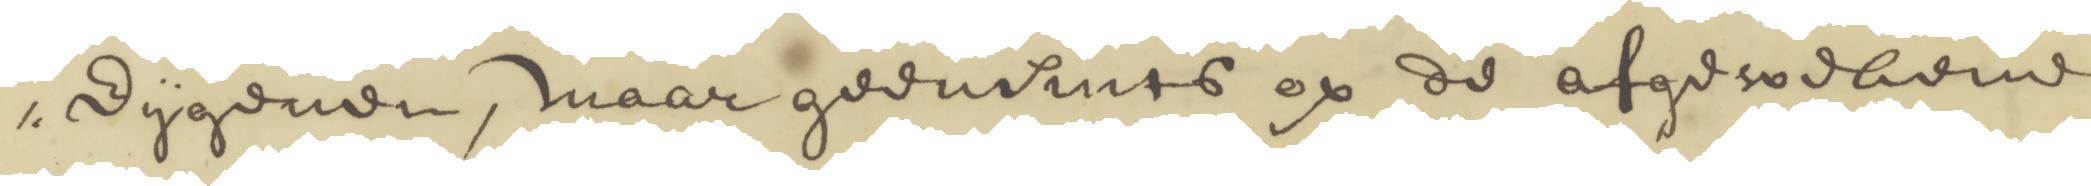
„Eijgenen, maar geensints op de afgewekene
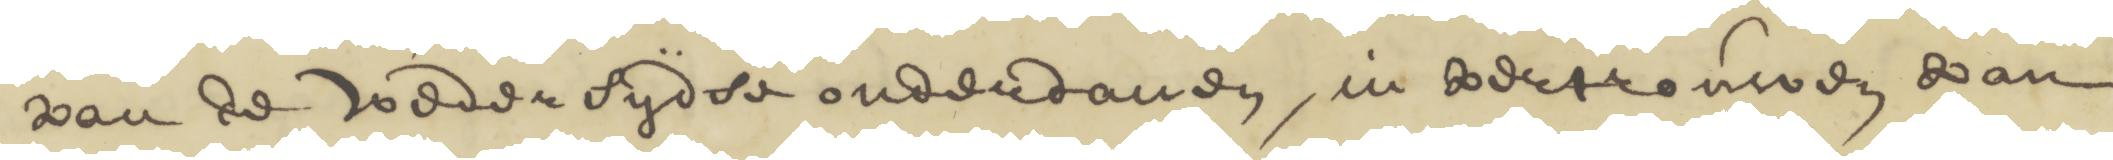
van de wedersijdse onderdanen, in vertrouwen dan
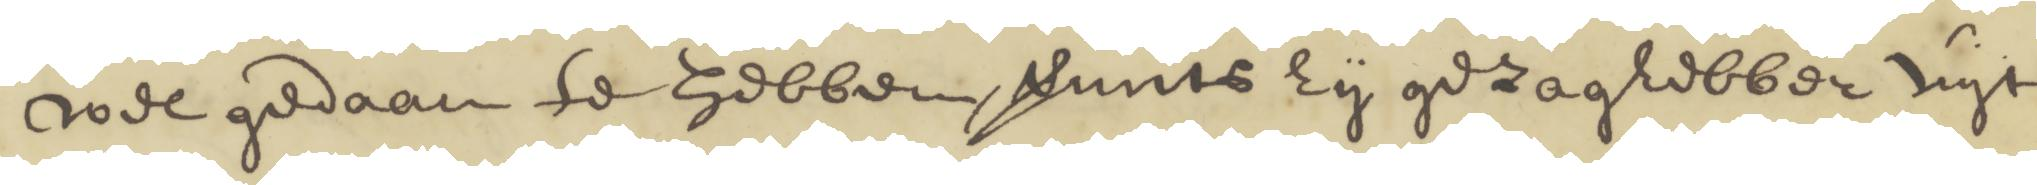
wel gedaan te hebben, vermits hij gezaghebber uijt
